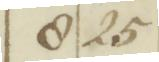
8 25
